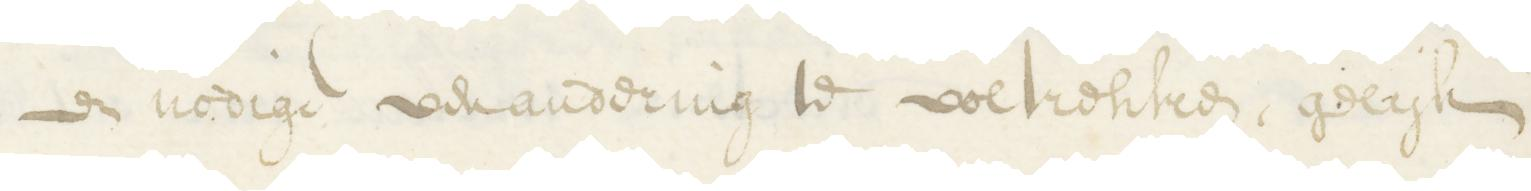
en nodige verandering te voltrekken, gelijk
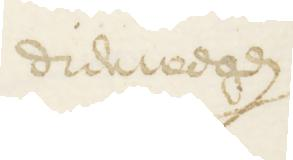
dierwegen
